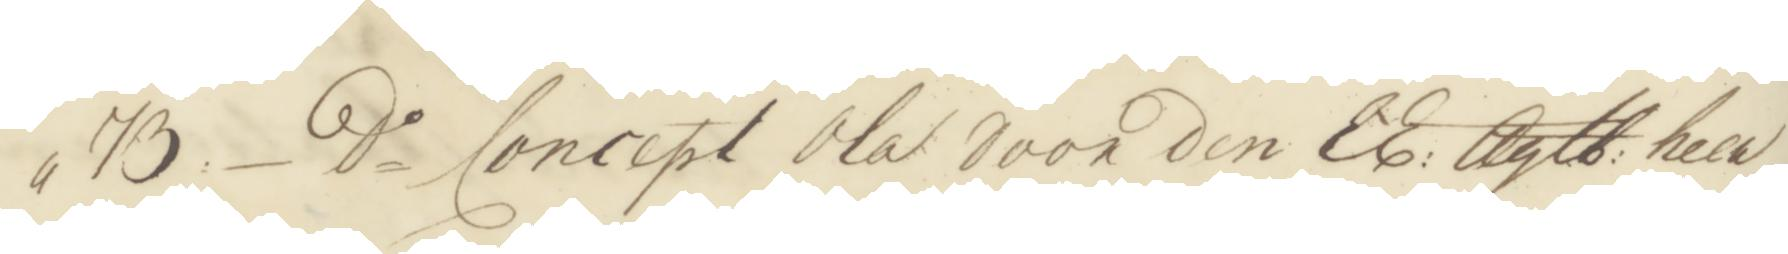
„ 73: - d=o Concept ola door den EE: Agtb: heer
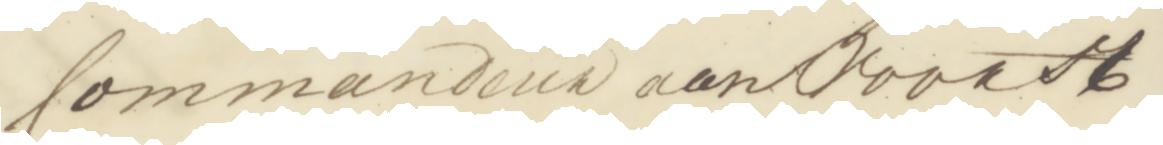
Commandeur aan voorsz
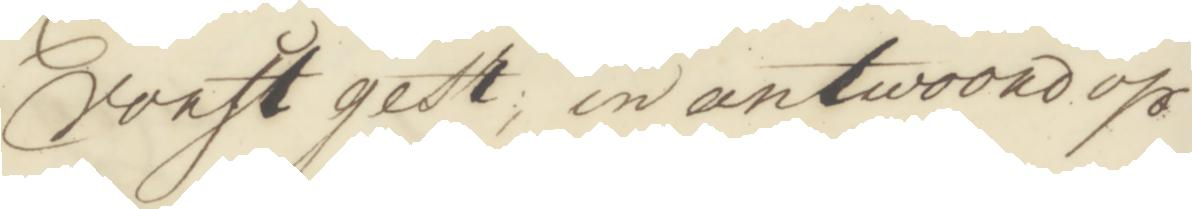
vorst gest: in antwoord op
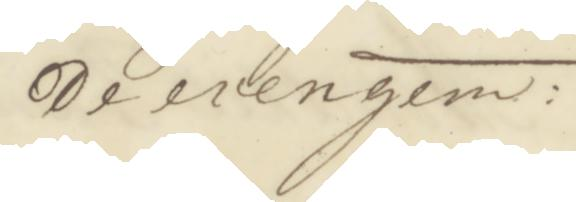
de evengem:
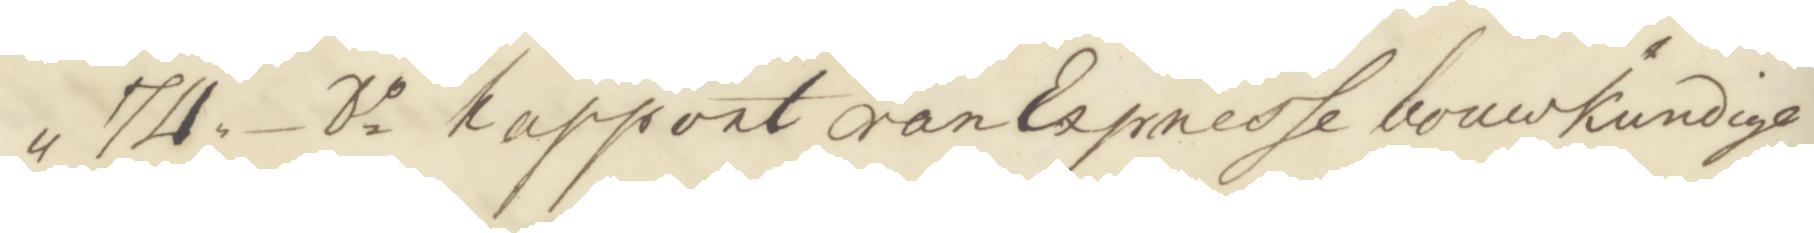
„ 74 „- d=o rapport van Expresse bouwkundige
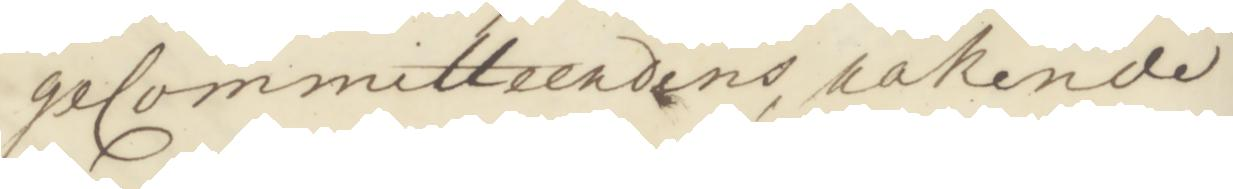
gecommitteerdens, rakende
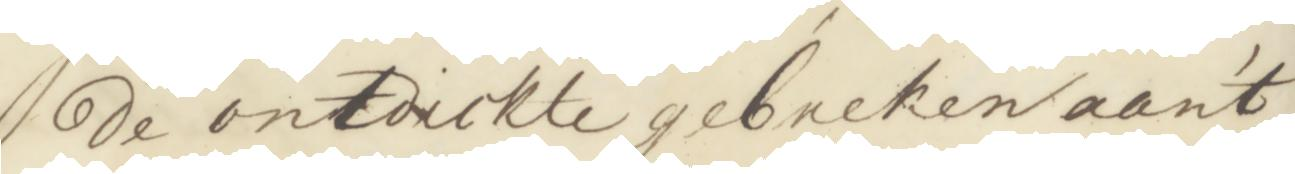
de ontdickte gebreken aan’t
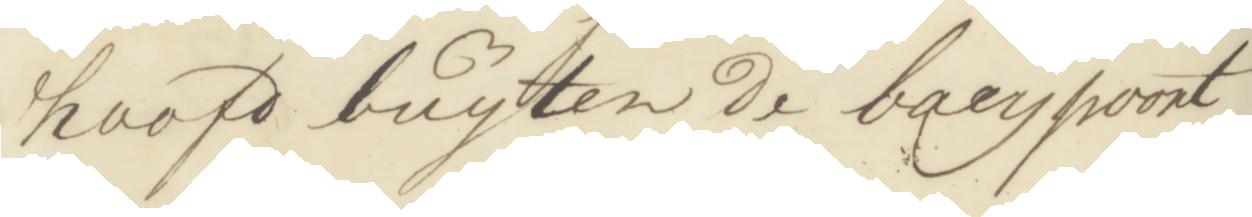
hoofd buyten de baeijpoort
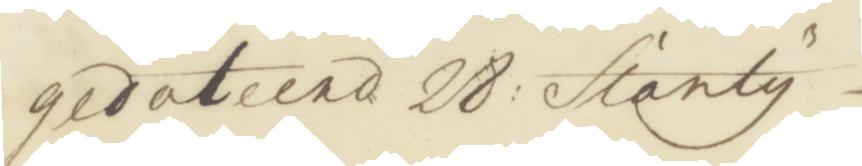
gedateerd 28: stantij
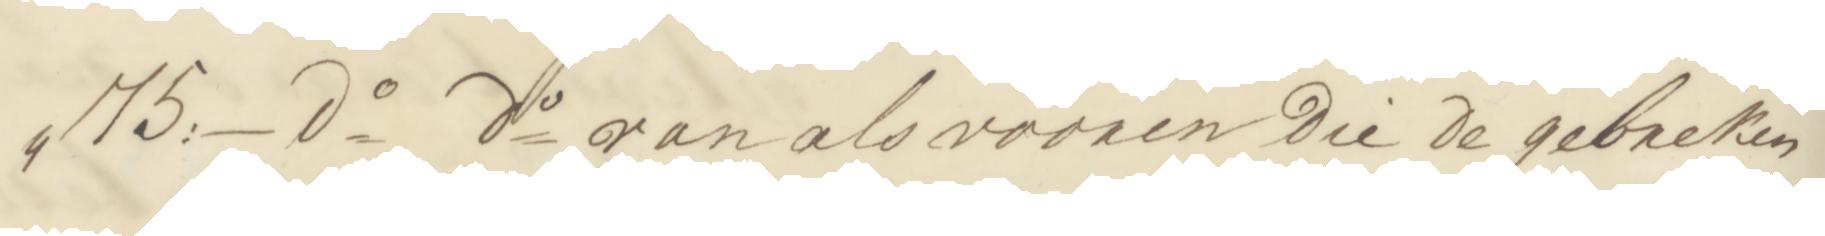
„ 75:- d=o d=o van als vooren die de gebreken
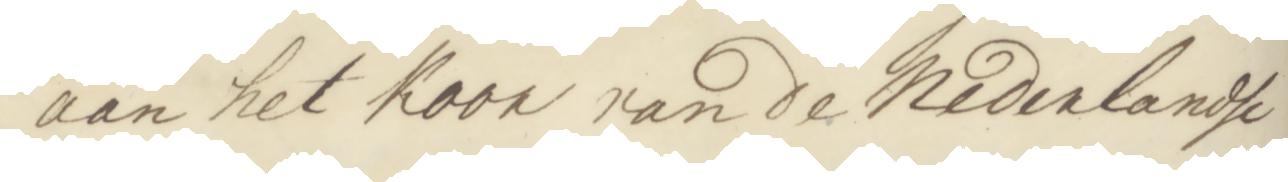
aan het koor van de Nederlandse
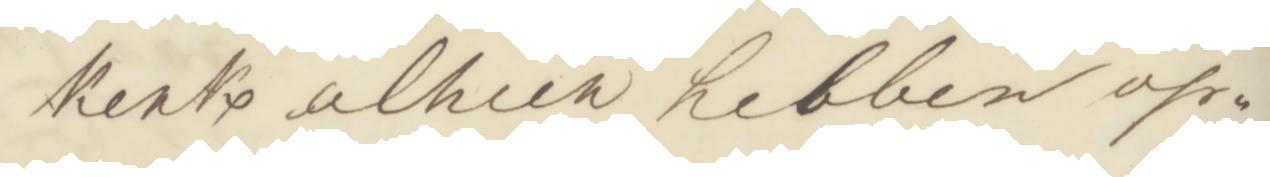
kerk alhier hebben op„
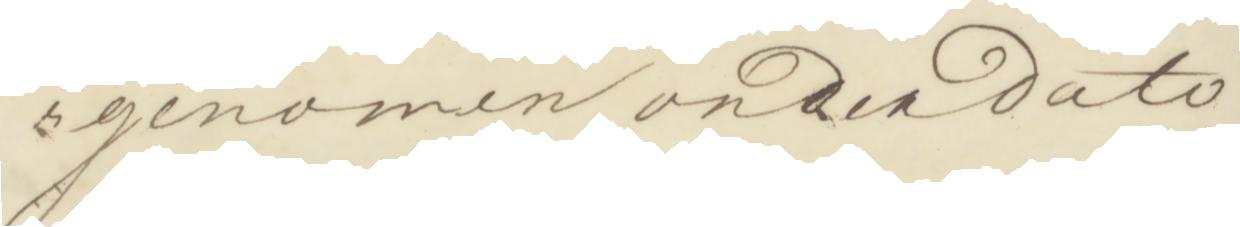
„genomen onder dato
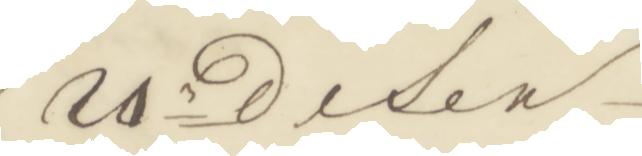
24=' deser
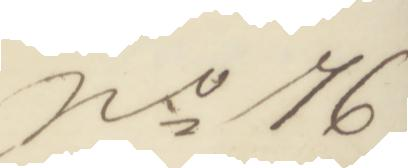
N=o 76
